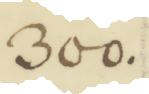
300.
